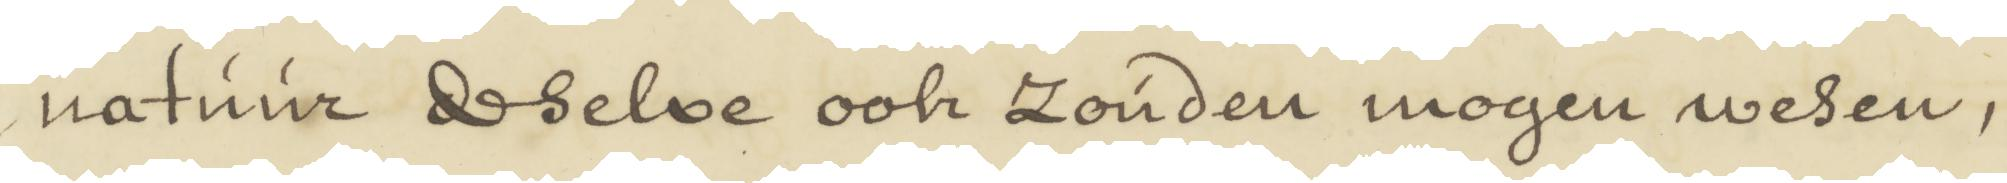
natuur deselve ook zouden mogen wesen,
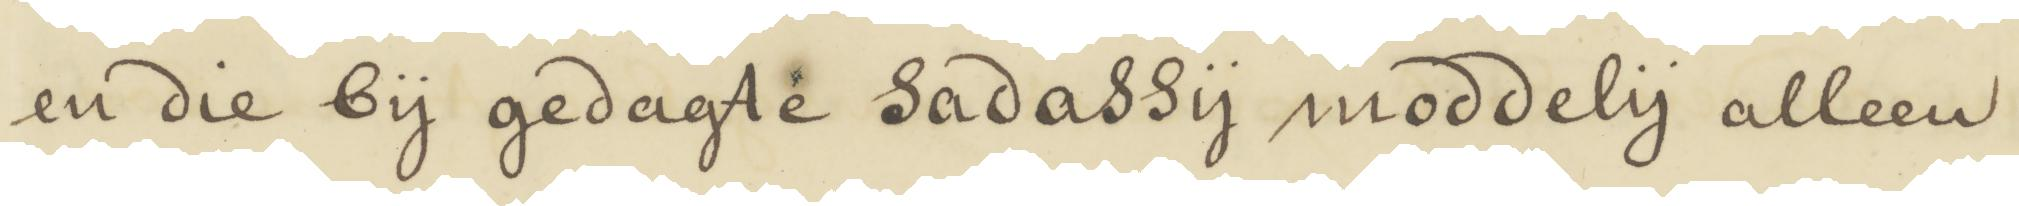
en die bij gedagte sadassij moddelij alleen
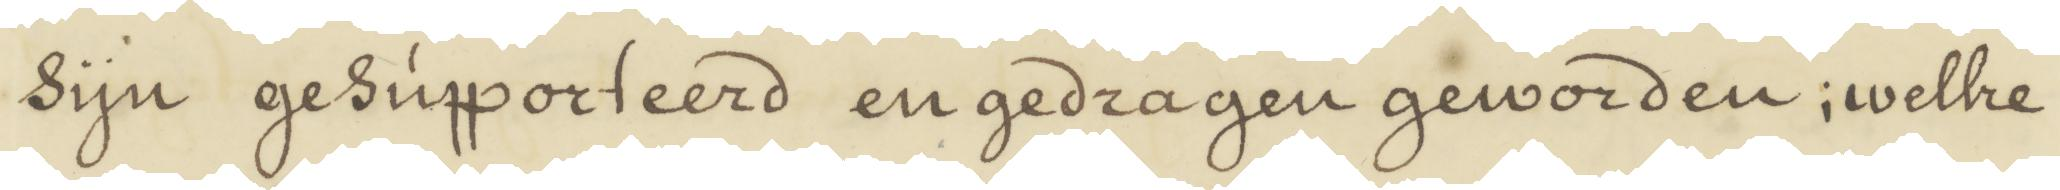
sijn gesupporteerd en gedragen geworden; welke
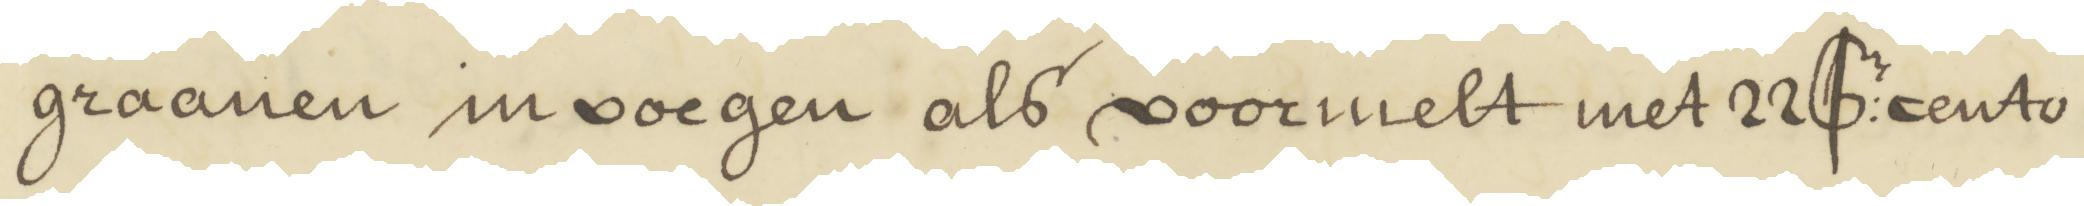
graanen in voegen als voormelt met 22 p:r cento
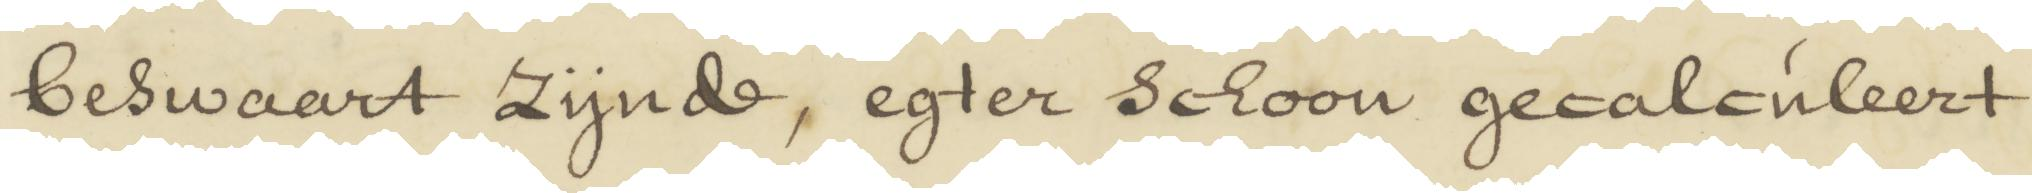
beswaart zijnde, egter schoon gecalculeert
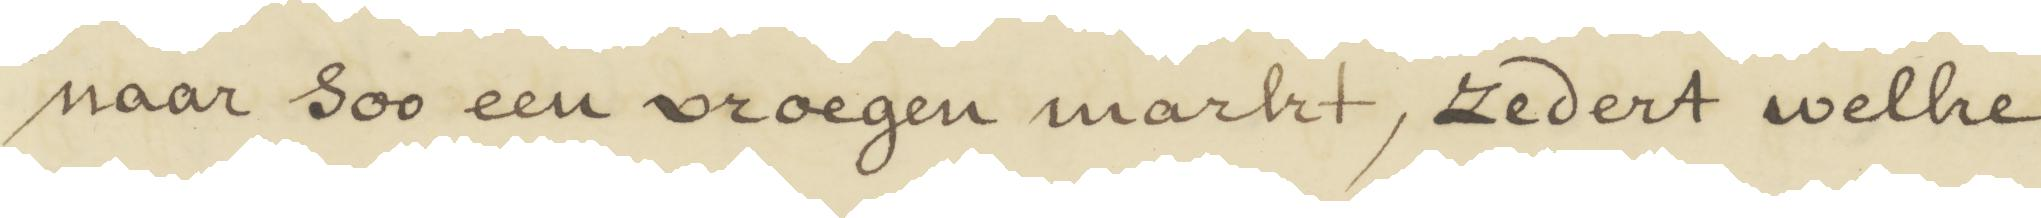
naar soo een vroegen markt, zedert welke
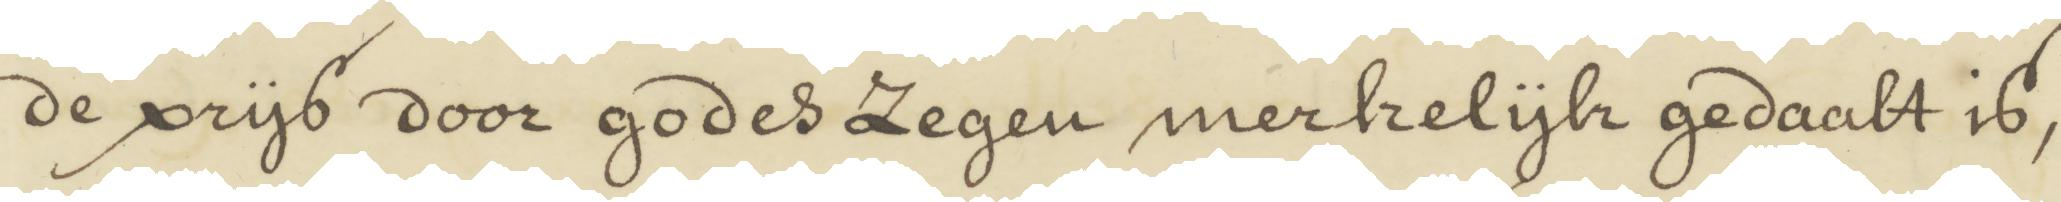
de prijs door godes zegen merkelijk gedaalt is,
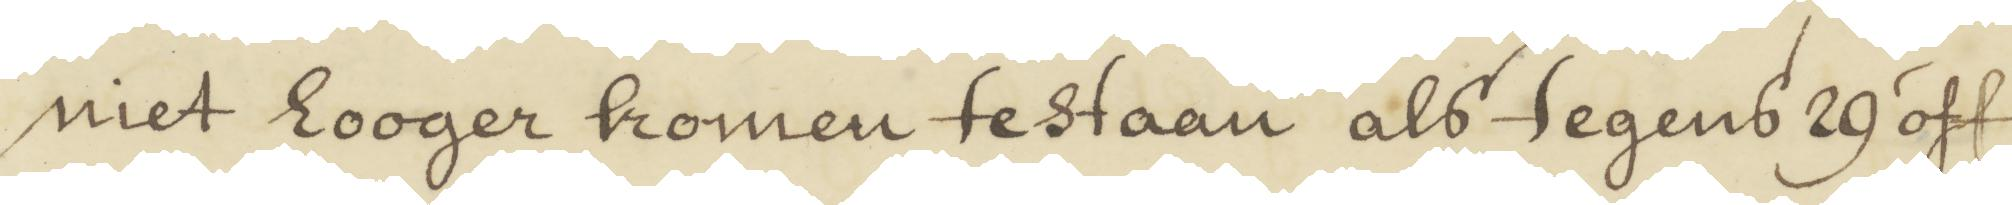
niet hooger komen te staan als tegens 29' off
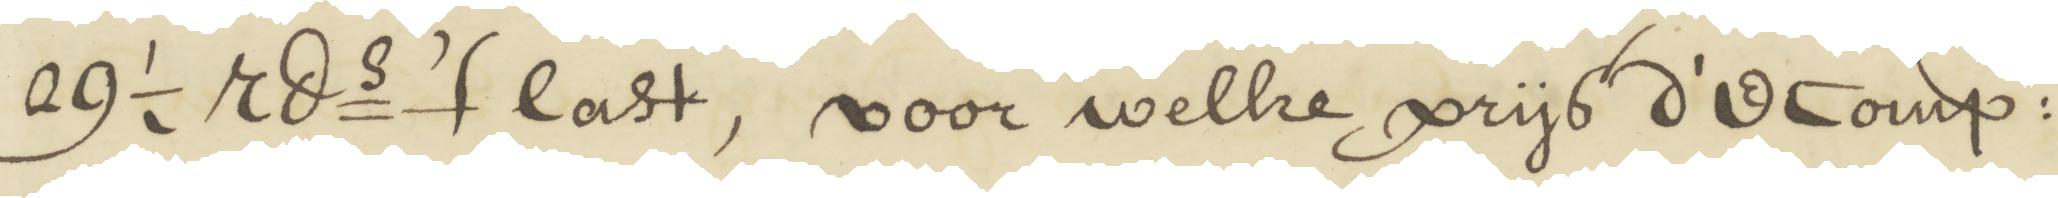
29½ rd=s 't last, voor welke prijs d’E Comp:
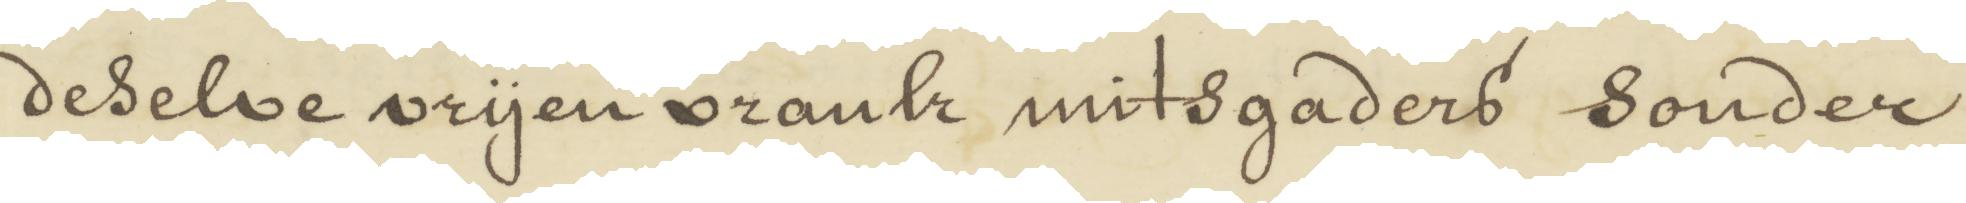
deselve vrijen vrank mitsgaders sonder
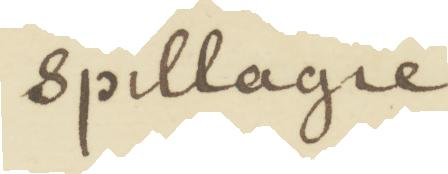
spillagie
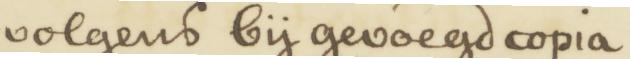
volgens bij gevoegd copia
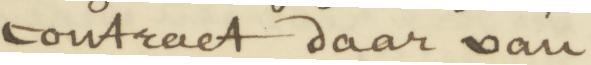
contract daar van
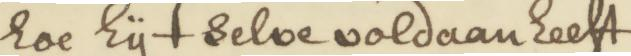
hoe hij ’t selve voldaan heeft
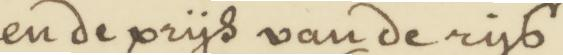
en de prijs van de rijs
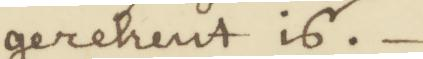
gerekent is. —
